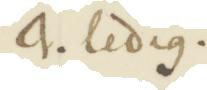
4. ledig.
